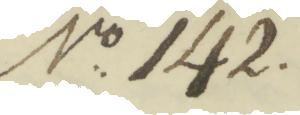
N„o 142.
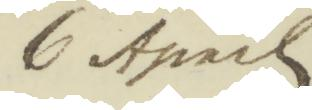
6 April
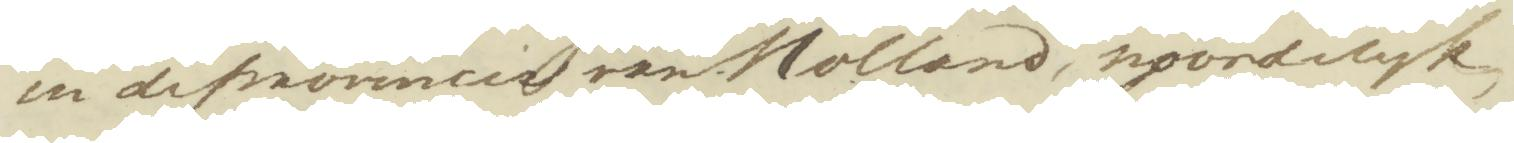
in de provincie van Holland, noordelyk,
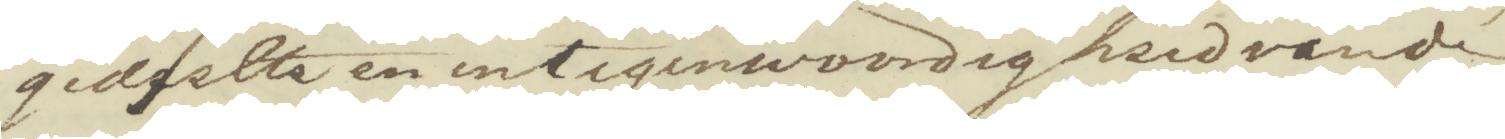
gedeelte en integenwoordigheid vande
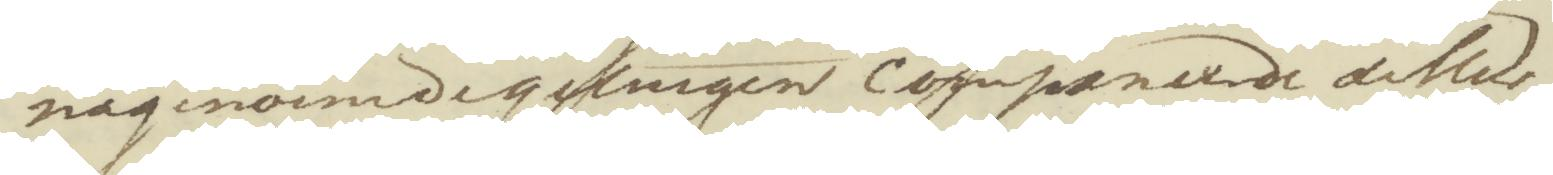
nagenoemdegetuigen compareerde deHeer
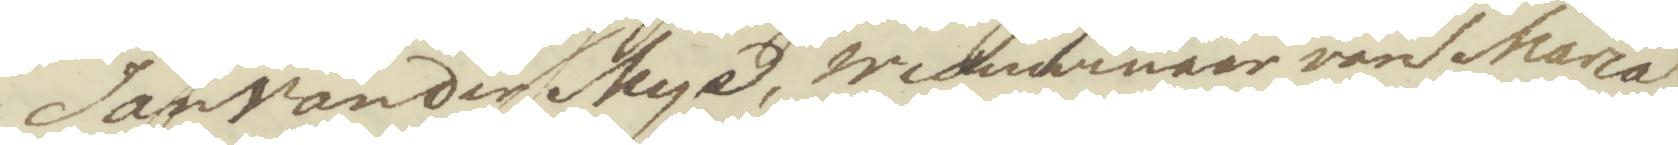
Ian van der Mye, Weduwnaar van Maria
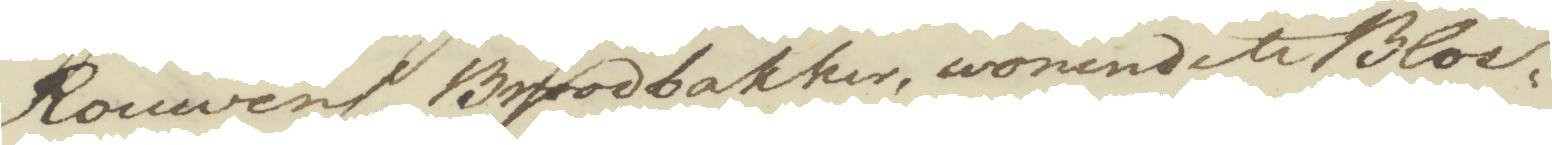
Rouwens, Broodbakker, wonende te Bloe„
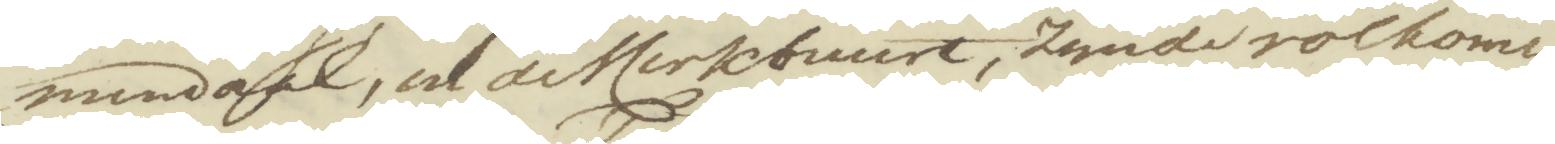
mendaal, in de Kerkbuurt, zynde volkomen
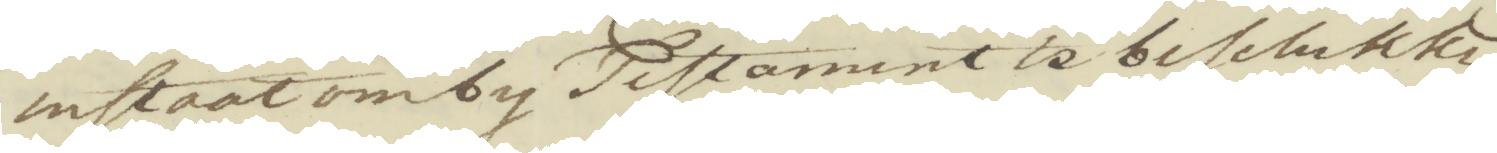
instaat om bij Testament te beschikken
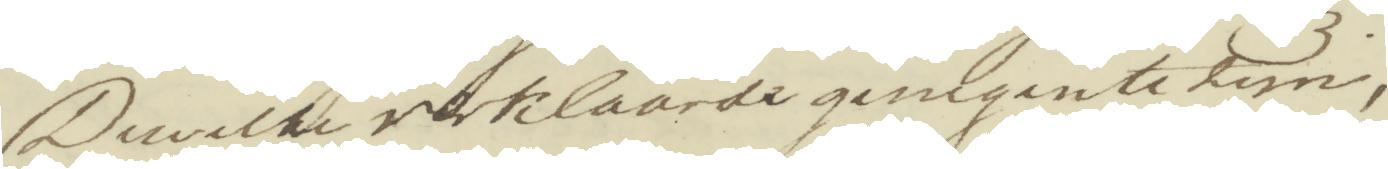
Dewelke verklaarde genegente zyn,
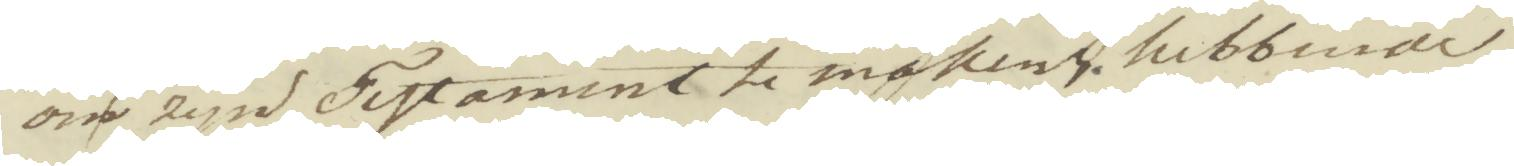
om zijn Testament te maken, hebbende
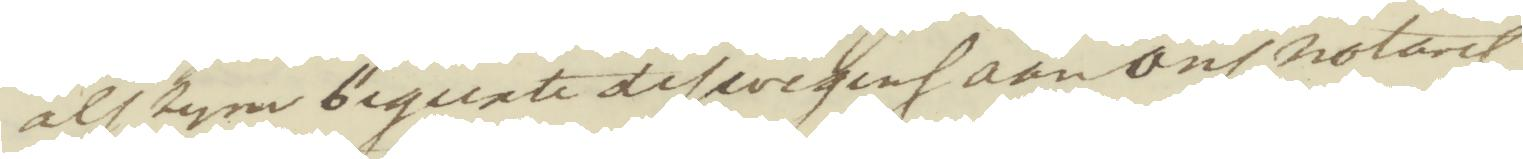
als zyne begeerte deswegens aan ons notaris
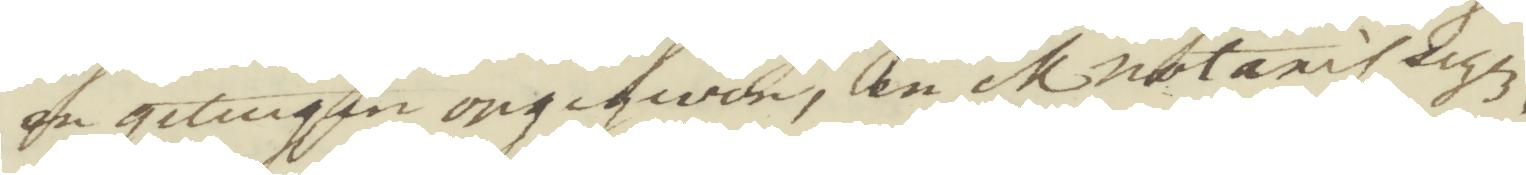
en getuigen opgegeven, en ik notaris eigen
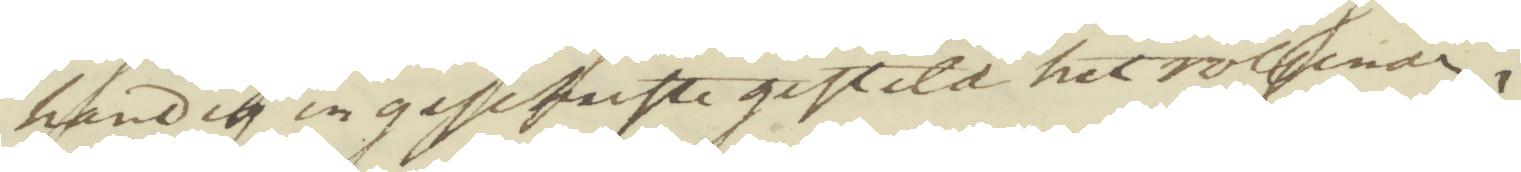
handig in geschrifte gesteld het volgende,
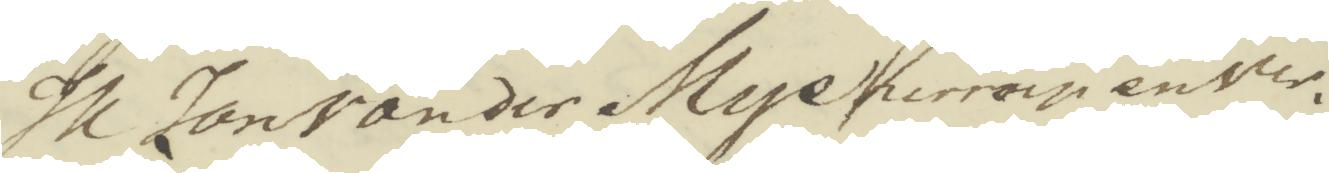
Jk JanVander Mye herroep en ver„
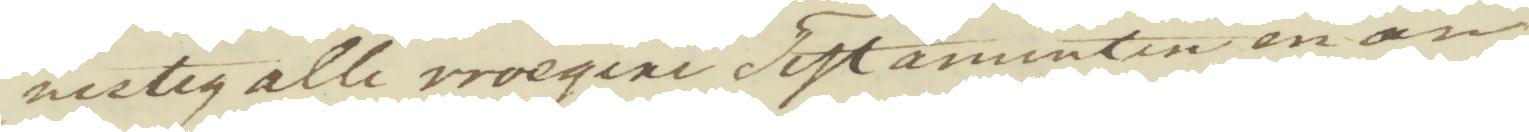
nietig alle vroegere Testamenten en an
